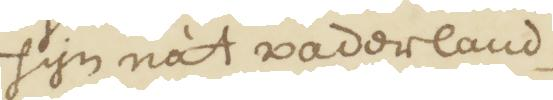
sijn na ’t vaderland
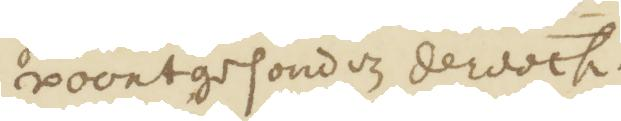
voort gesonden de reeck.
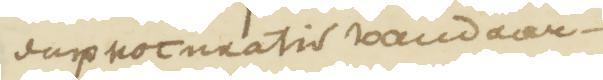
en procuratie van daar
